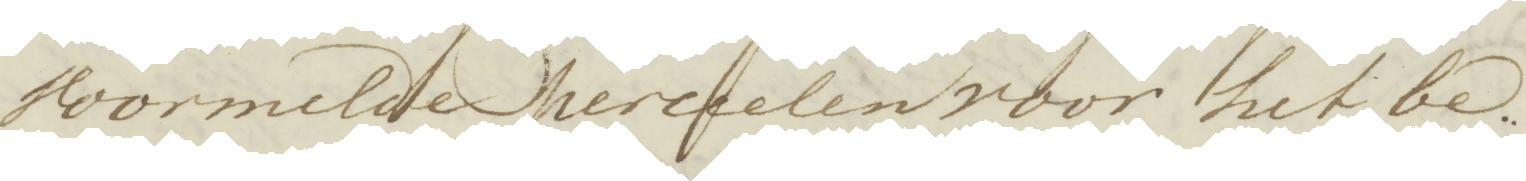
voormelde perceelen voor het be„
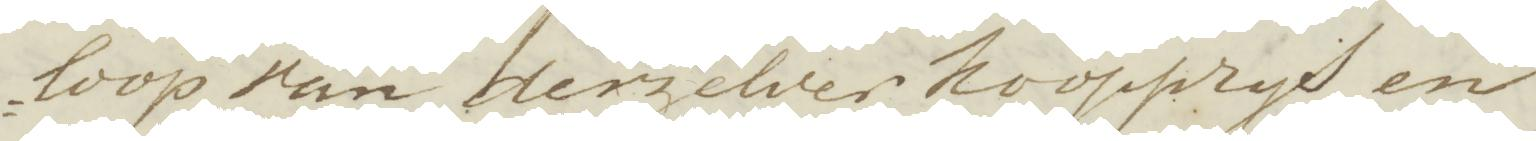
=loop van derzelver koopprys en
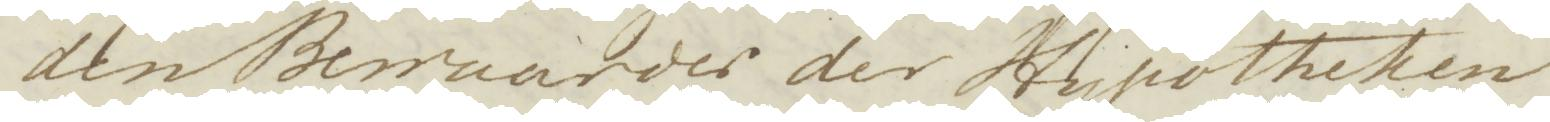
den Bewaarder der Hypotheken
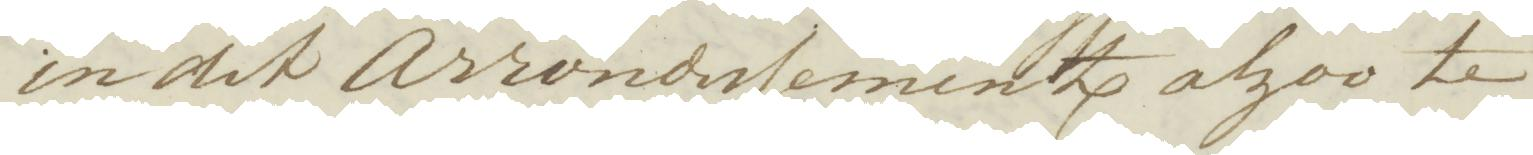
in dit Arrondissement alzoo te
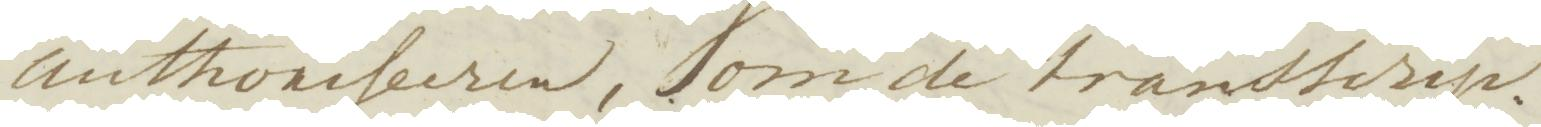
authoriseeren, om de transcrip„
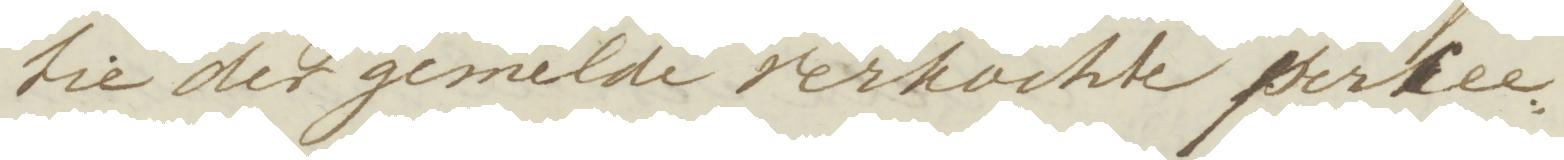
tie der gemelde verkochte percee„
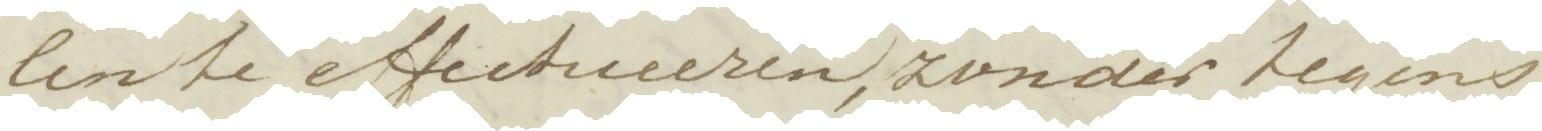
len te effectueeren, zonder tegens
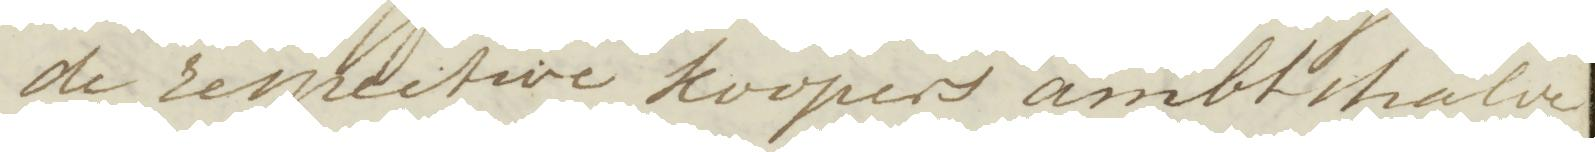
de respective koopers ambtshalve
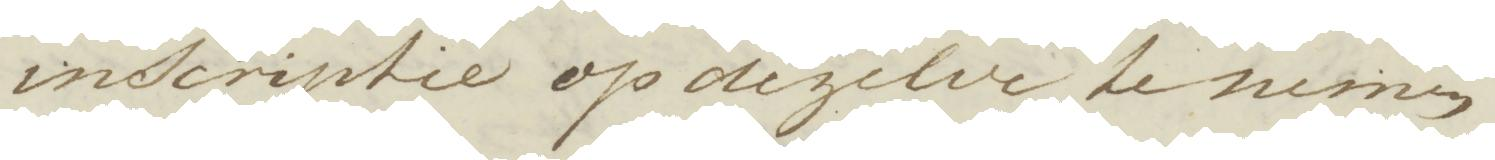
inscriptie op dezelve te nemen
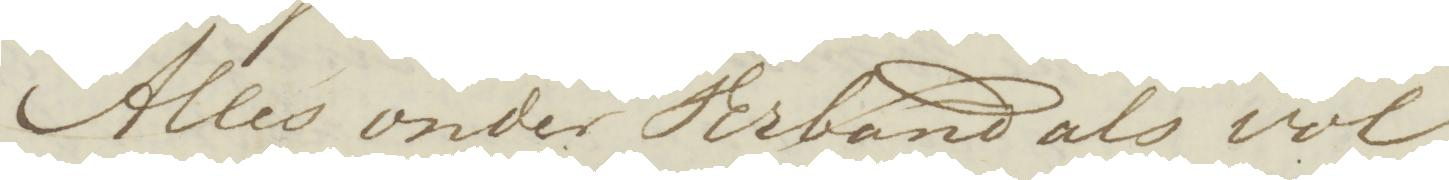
Alles onder Verband als vol
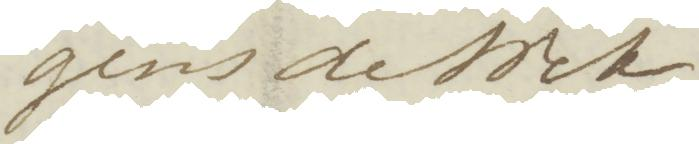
gens de Wet.
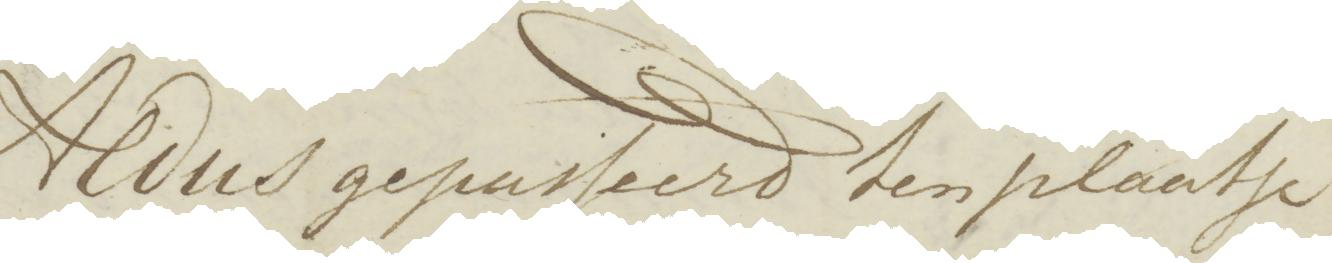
Aldus gepasseerd ten plaatse
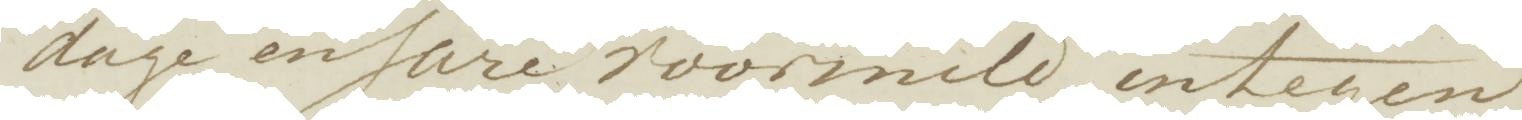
dage en Jare voormeld, integen
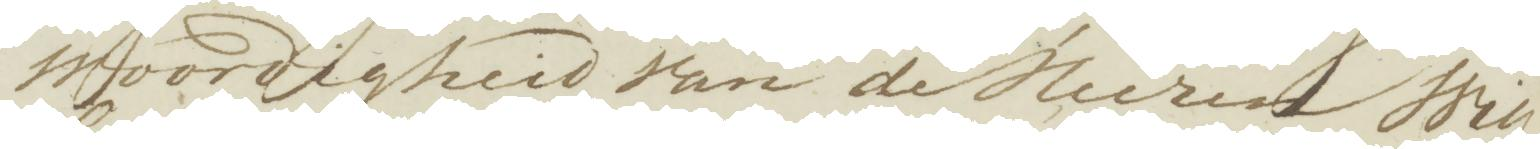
woordigheid van de Heeren Wig
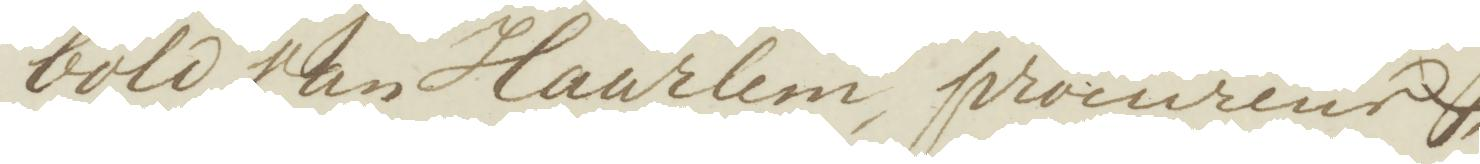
bold van Haarlem, procureur,
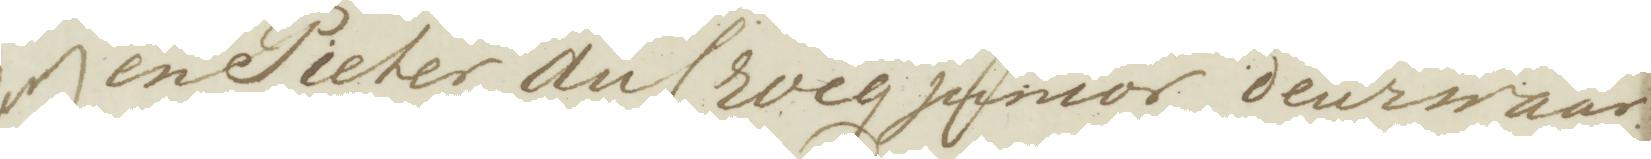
en Pieter du Crocq junior, deurwaar„
